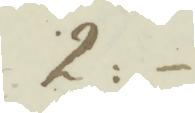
2 : —
